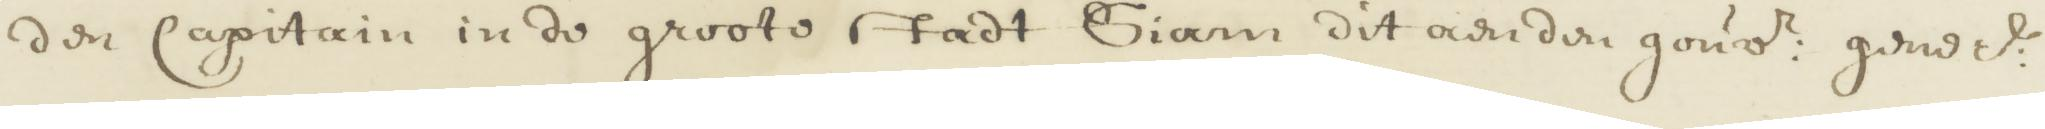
den Capitain in de groote stadt Siam dit aen den gouv:r gener:l
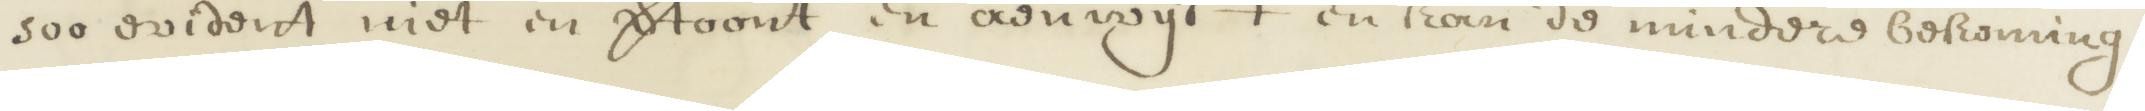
soo evident niet en vertoont en aenwijst en kan de mindere bekoming
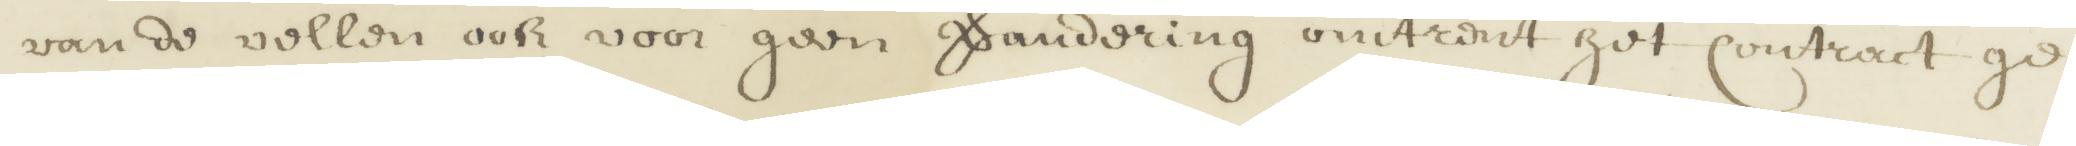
van de vellen ook voor geen verandering omtrent het contract ge
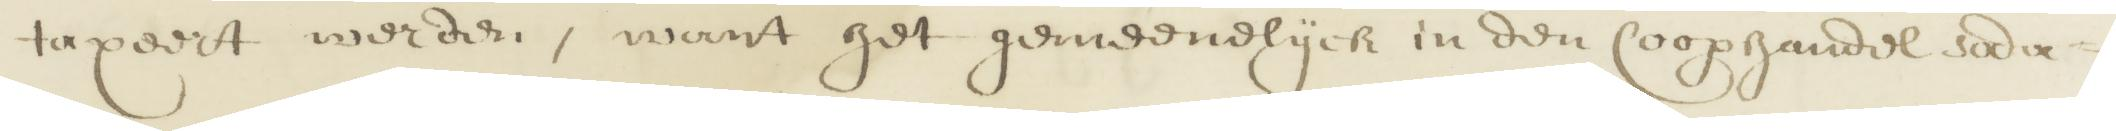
taxeert werden, want het gemeenelijck in den Coophandel soda=
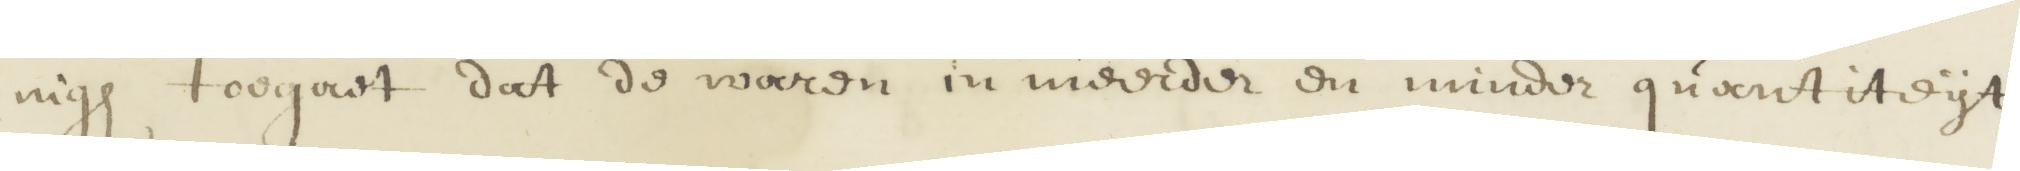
nigh toegaet dat de waren in meerder en minder quantiteijt
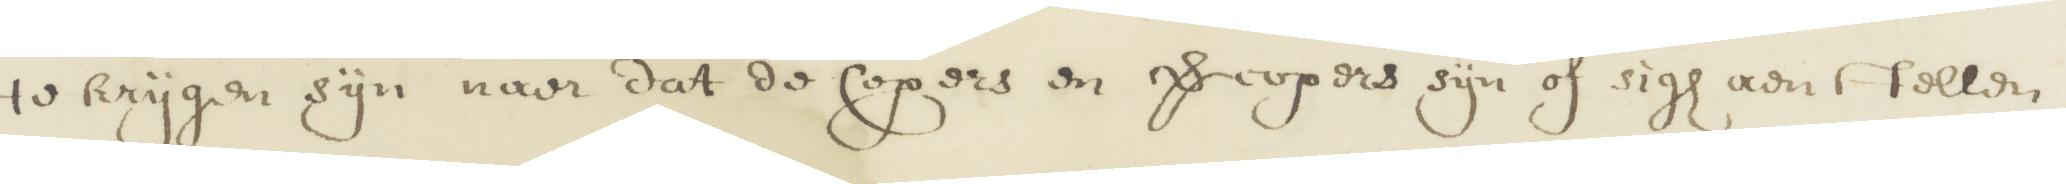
te krijgen sijn naer dat de Copers en vercopers sijn of sigh aen stellen
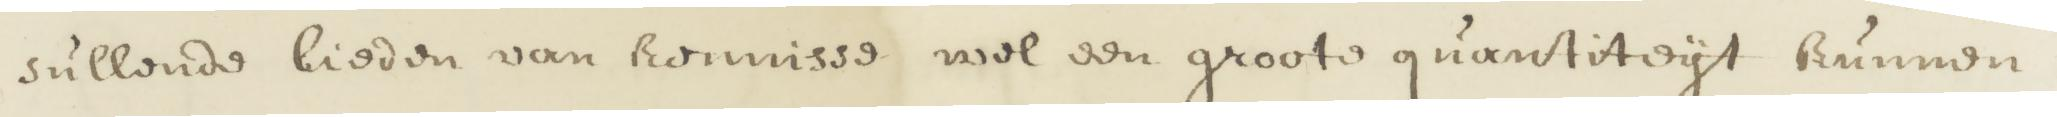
sullende lieden van kennisse wel een groote quantiteijt kunnen
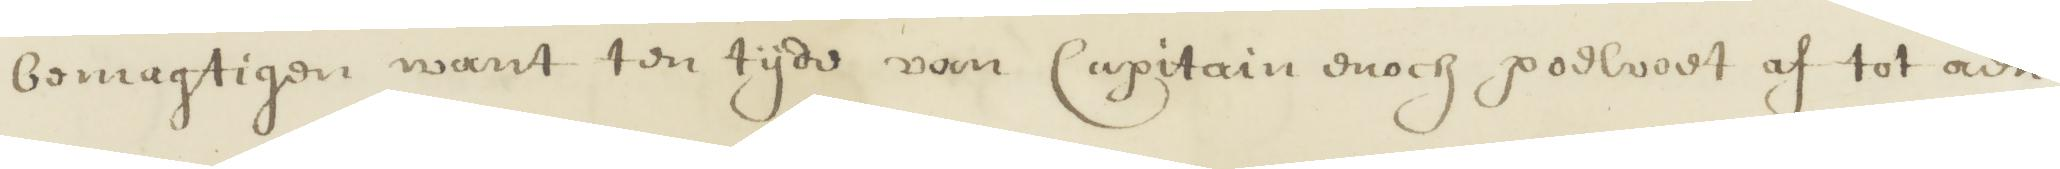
bemagtigen want ten tijde van Capitain enoch poelvoet af tot aen
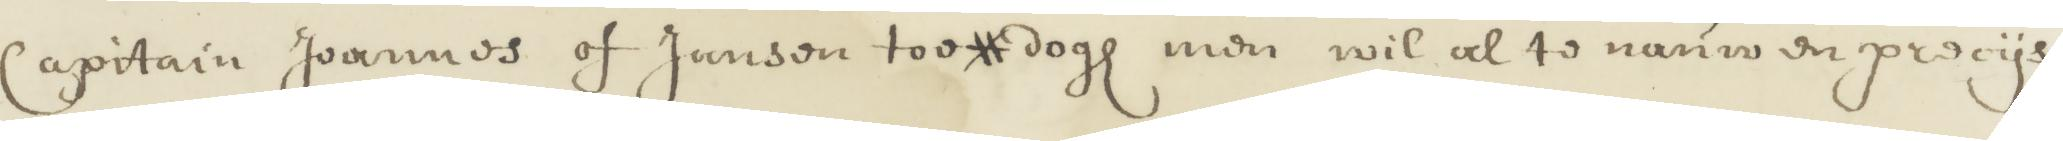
Capitain Joannes of Jansen toe dogh men wil al te nauw en precijs
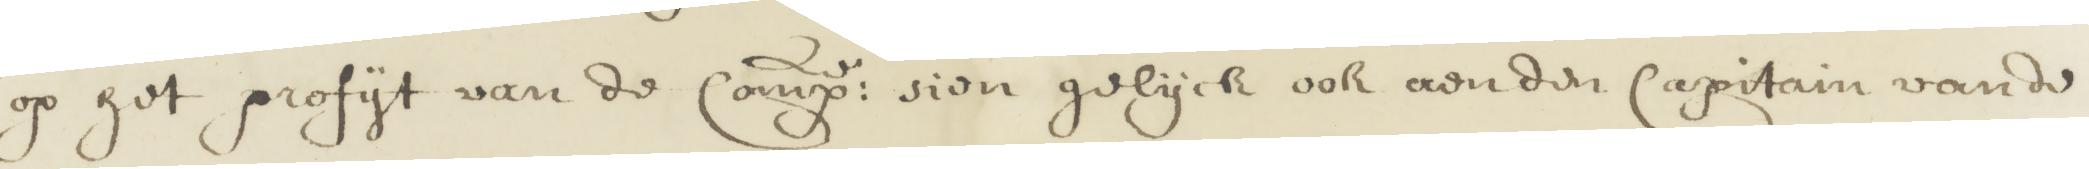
op het profijt van de Comp:e sien gelijck ook aen den Capitain van de
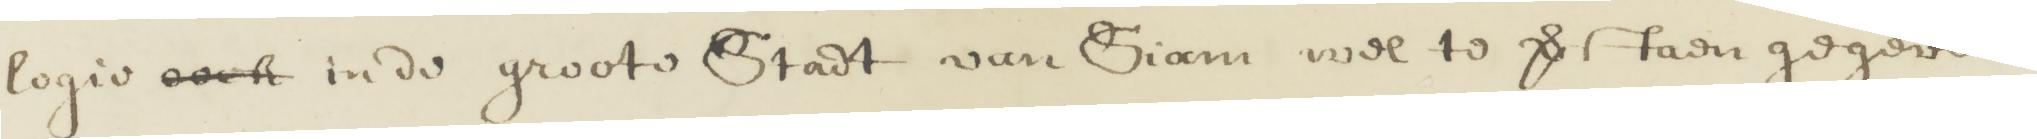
logie oock in de groote Stadt van Siam wel te verstaen gegeven
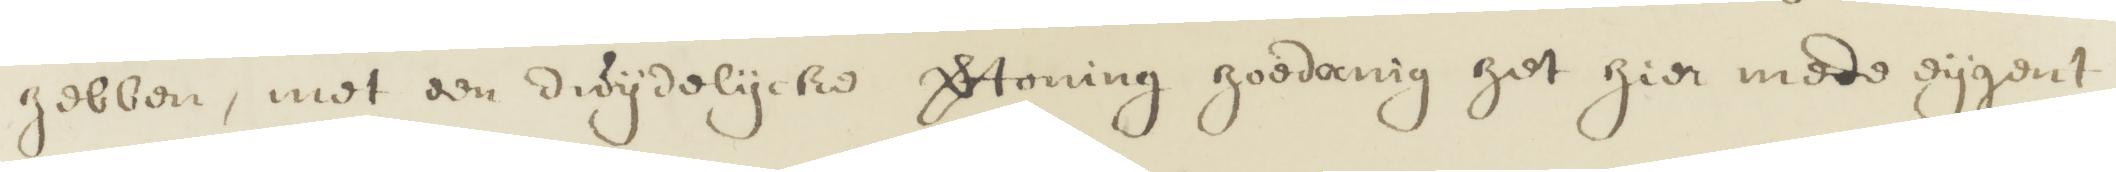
hebben, met den duijdelijcke vertoning hoedanig het hier mede eijgent
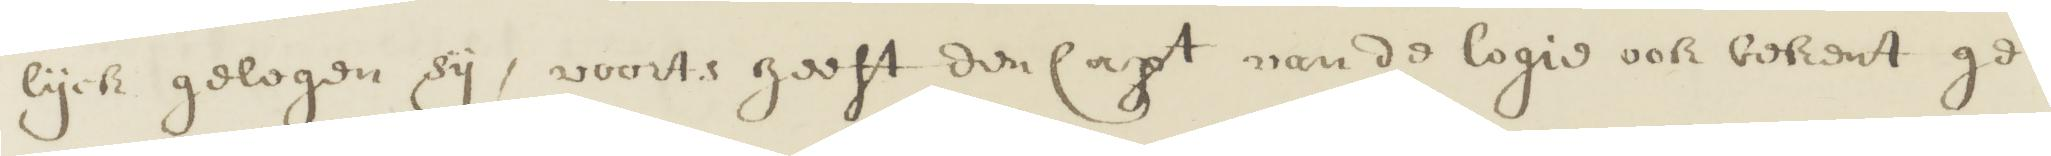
lijck gelegen sij, voorts heeft den Capt van de logie ook bekent ge=
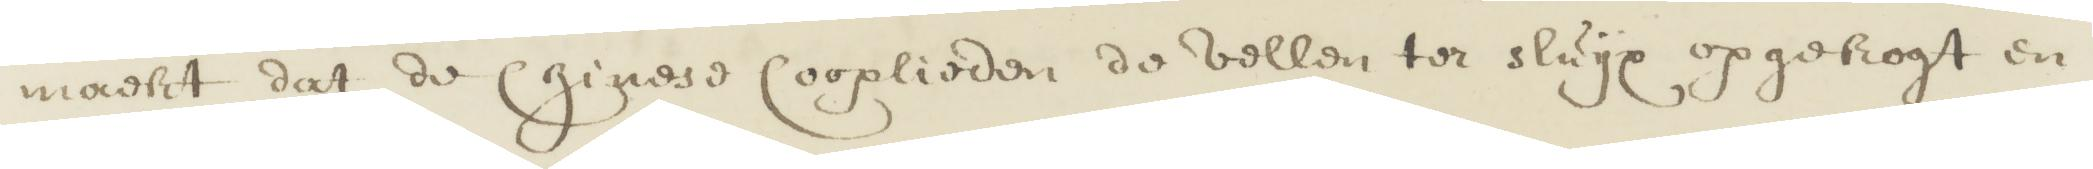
maekt dat de Chinese Cooplieden de vellen ter sluijx opgekogt en
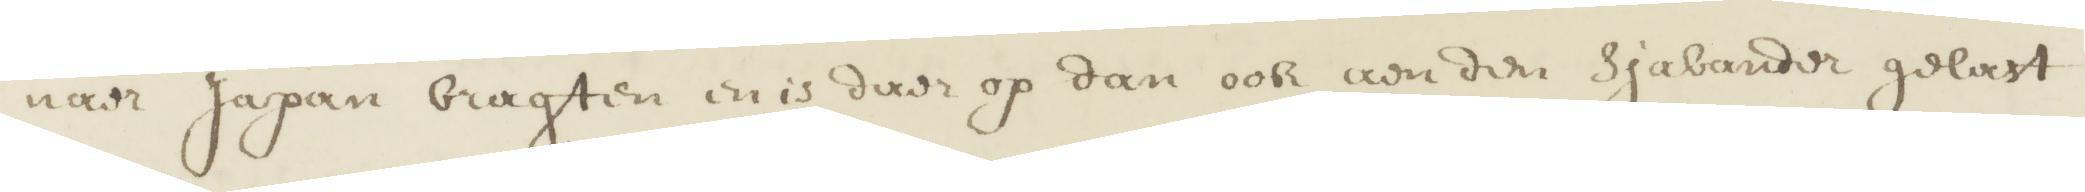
naer Japan bragten en is daer op dan ook aen den sjabander gelast
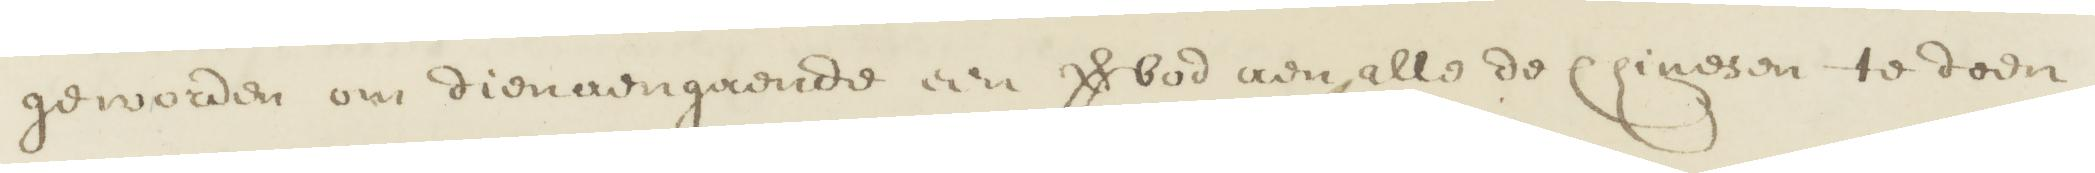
geworden om dienaengaende een verbod aen, alle de Chinesen te doen
